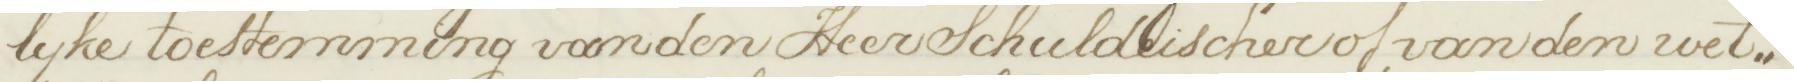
lyke toestemming van den Heer Schuldeischer of van den wet„
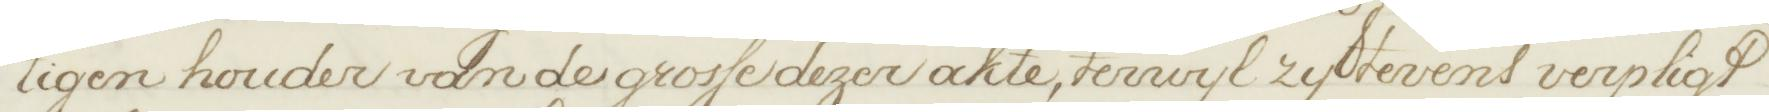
tigen houder van de grosse dezer akte, terwyl zy tevens verpligt
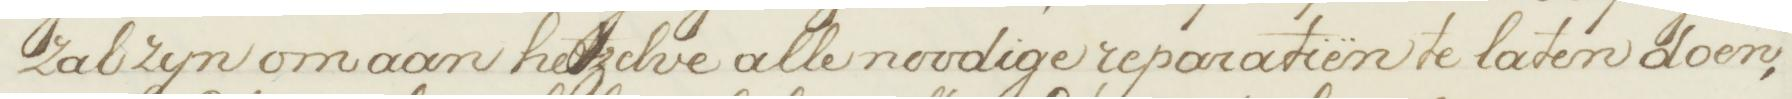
zal zyn om aan hetzelve alle noodige reparatiën te laten doen,
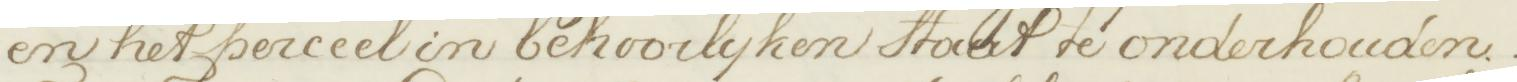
en het perceel in behoorlyken staat te onderhouden.
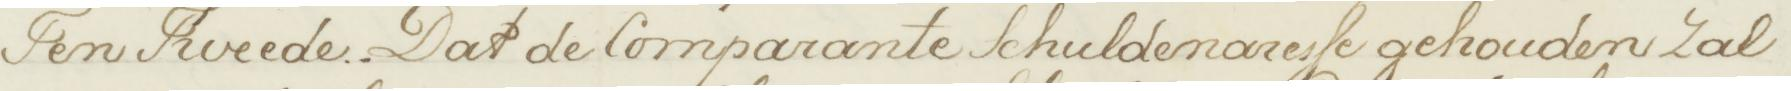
Ten Tweede.- Dat de Comparante schuldenaresse gehouden zal
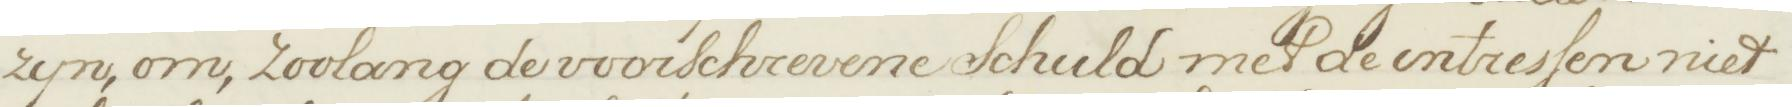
zyn, om, zoolang de voorschrevene Schuld met de intressen niet
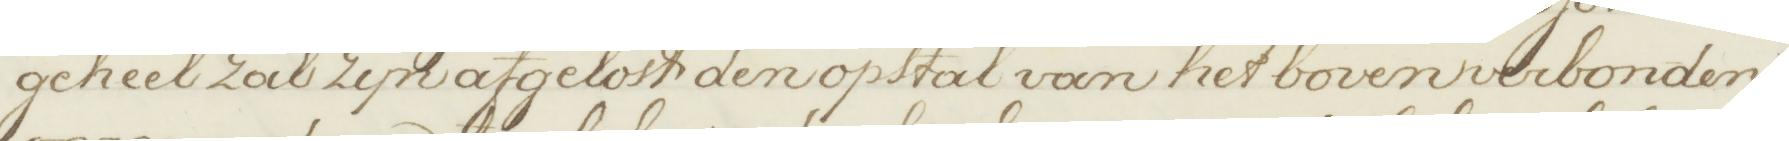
geheel zal zyn afgelost den opstal van het boven verbonden
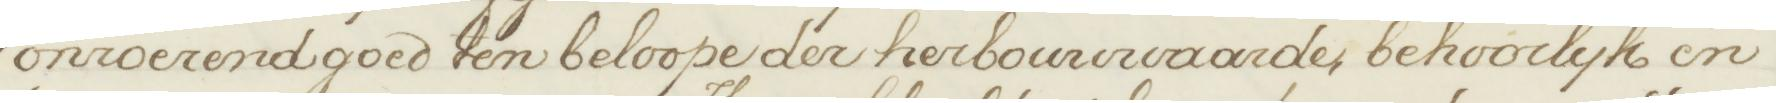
onroerend goed ten beloope der herbouwwaarde, behoorlyk en
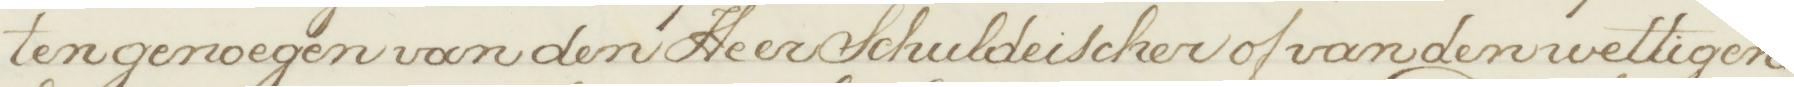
ten genoegen van den Heer Schuldeischer of van den wettigen
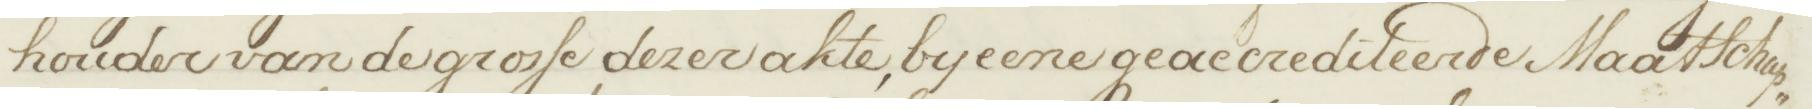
houder van de grosse dezer akte, by eene geaccrediteerde Maatschap„
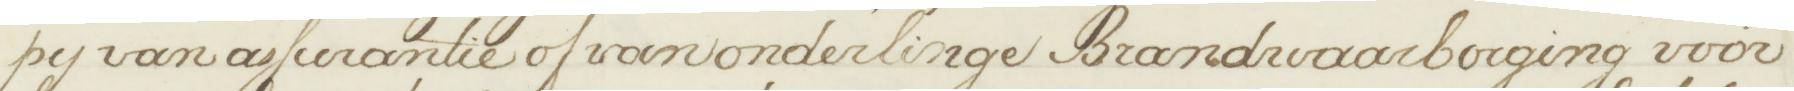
py van assurantie of van onderlinge Brandwaarborging voor
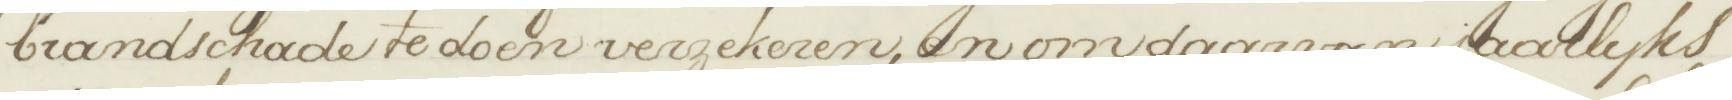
brandschade te doen verzekeren, en om daarvan jaarlyks
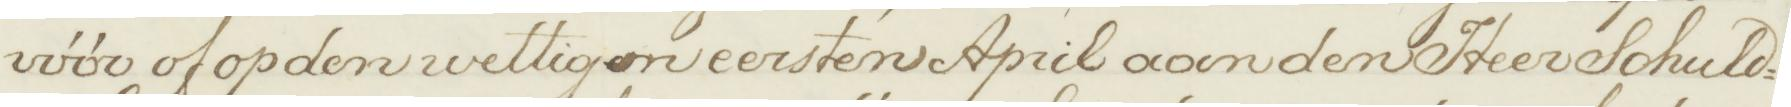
vóór of op den wettigen eersten April aan den Heer Schuld.
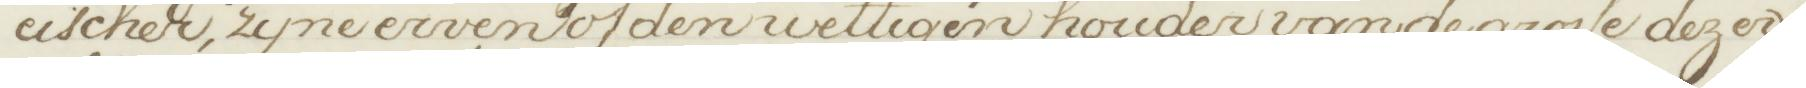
eischer, zyne erven of den wettigen houder van de grosse dezer
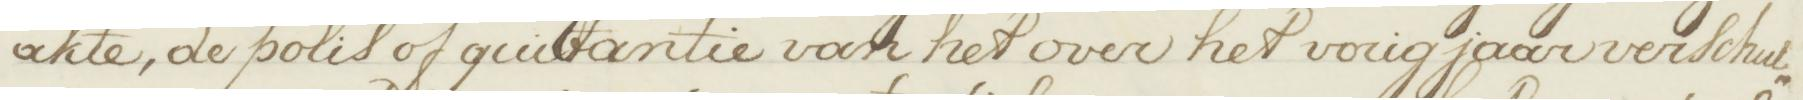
akte, de polis of quitantie van het over het vorig jaar verschul
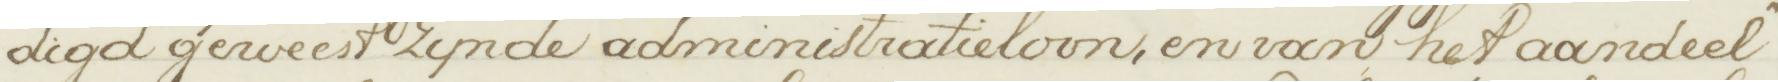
digd geweest zynde administratieloon, en van het aandeel
